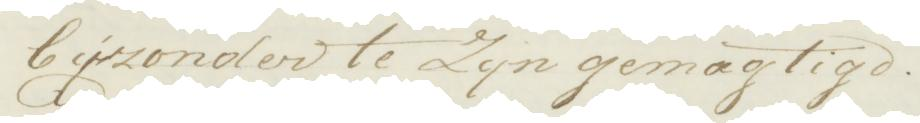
bijzonder te zijn gemagtigd
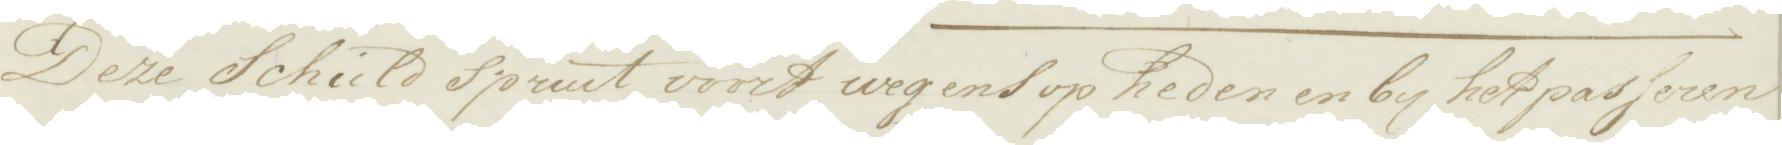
Deze schuld spruit voort wegens op heden en by het passeren
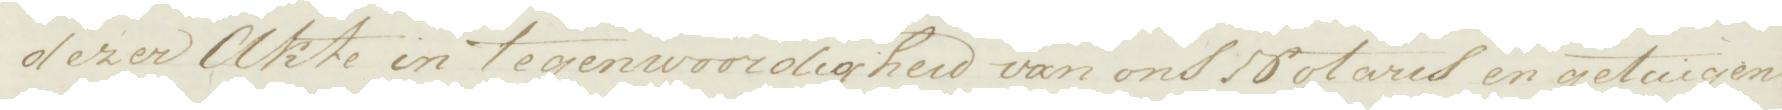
dezer Akte in tegenwoordigheid van ons Notaris en getuigen
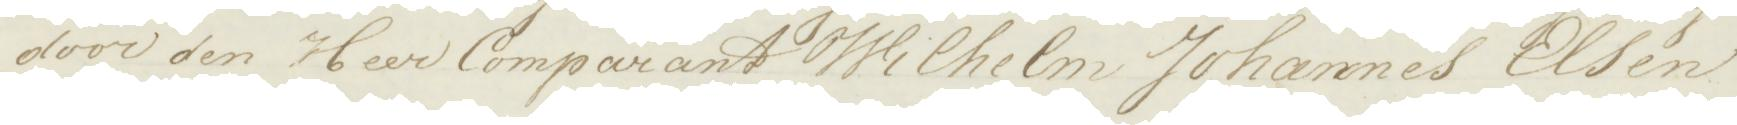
door den Heer Comparant Wilhelm Johannes Elsen
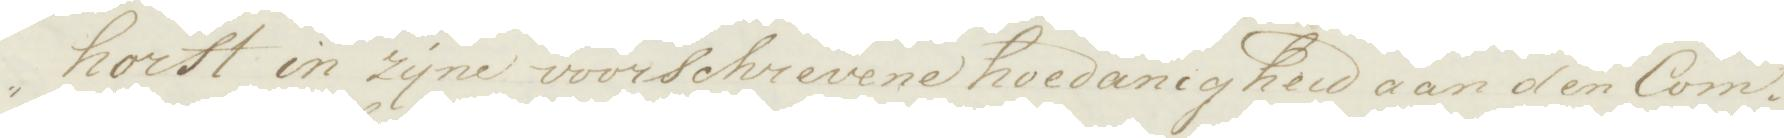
„horst in zijne voorschrevene hoedanigheid aan den Com„
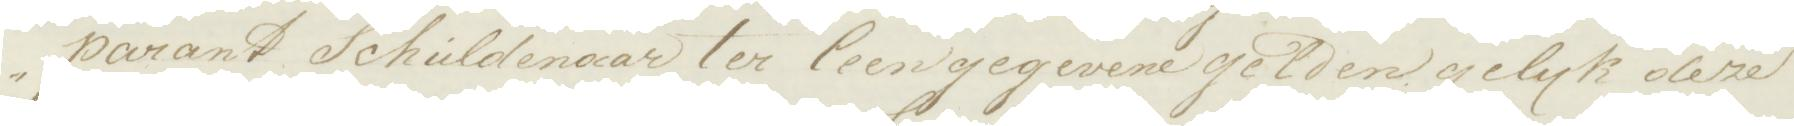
„parant Schuldenaar ter leen gegevene gelden gelyk deze
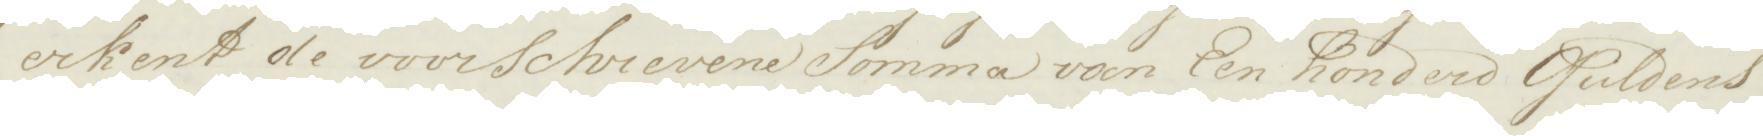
erkent de voorschrevene Somma van Een honderd Guldens
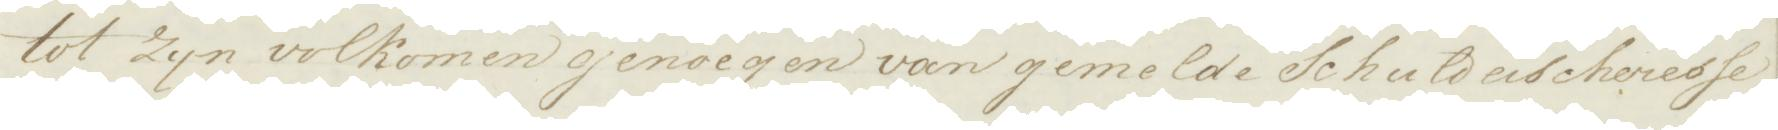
tot zijn volkomen genoegen van gemelde Schuld eischeresse
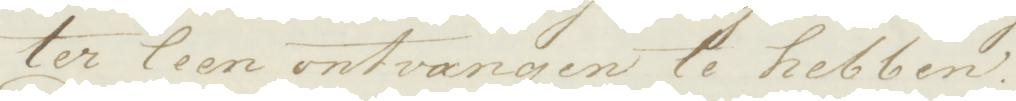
ter leen ontvangen te hebben.
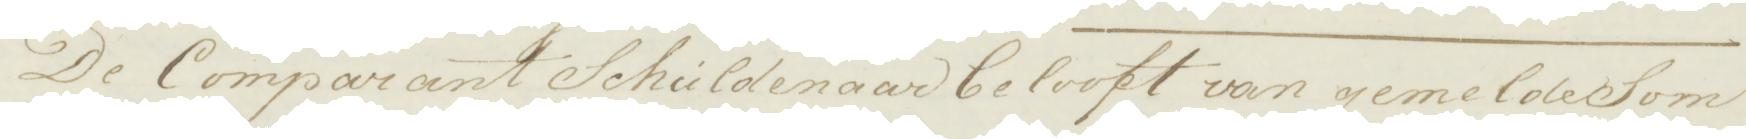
De Comparant schuldenaar belooft van gemelde som
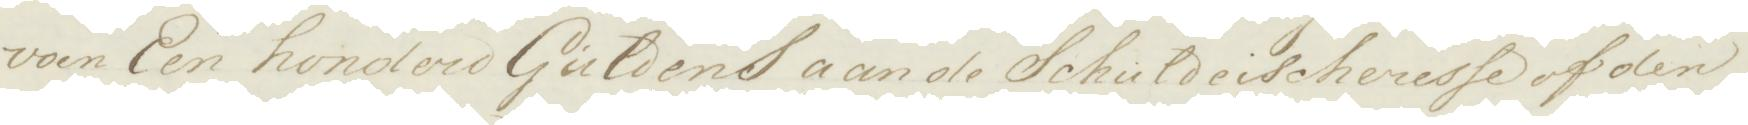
van Een honderd Guldens aan de Schuldeischeresse of den
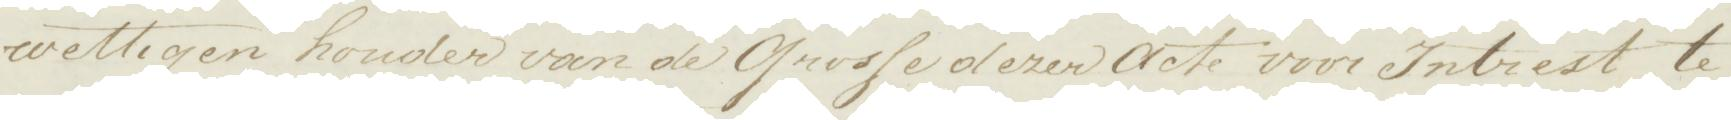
wettigen houder van de Grosse dezer Acte voor Intrest te
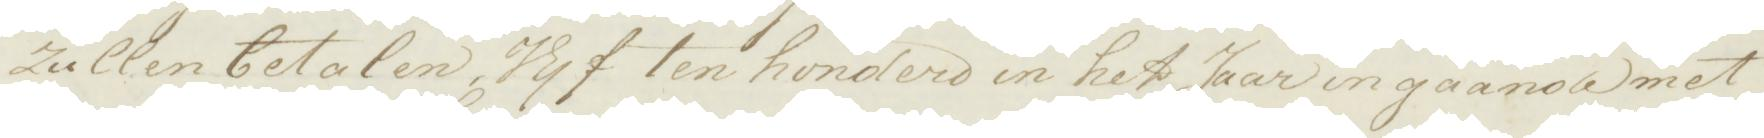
zullen betalen, Vijf ten honderd in het Jaar ingaande met
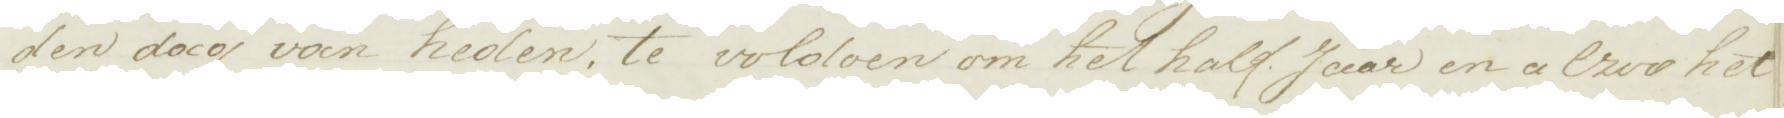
den dag van heden, te voldoen om het half Jaar en alzoo het
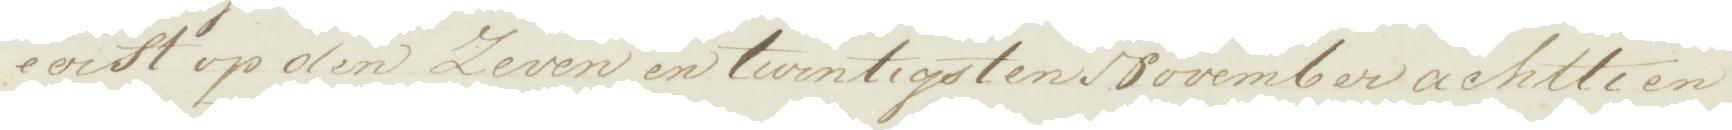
eerst op den Zeven en twintigsten November achttien
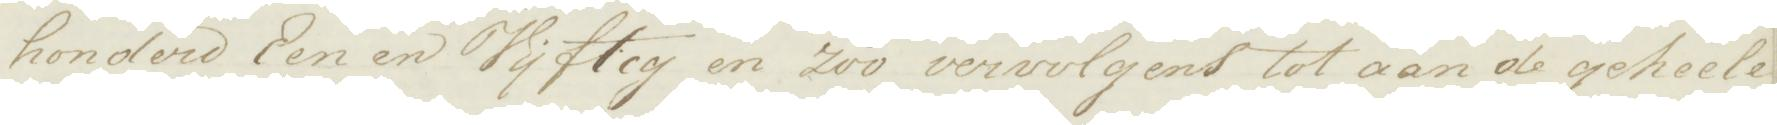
honderd Een en Vijftig en zoo vervolgens tot aan de geheele
